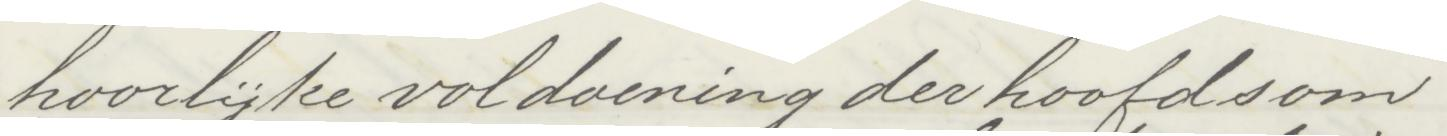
hoorlijke voldoening der hoofdsom
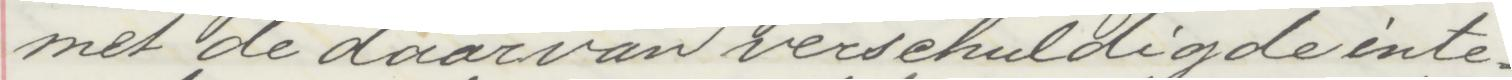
met de daarvan verschuldigde inte„
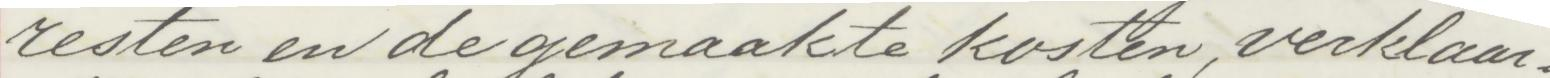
resten en de gemaakte kosten, verklaar„
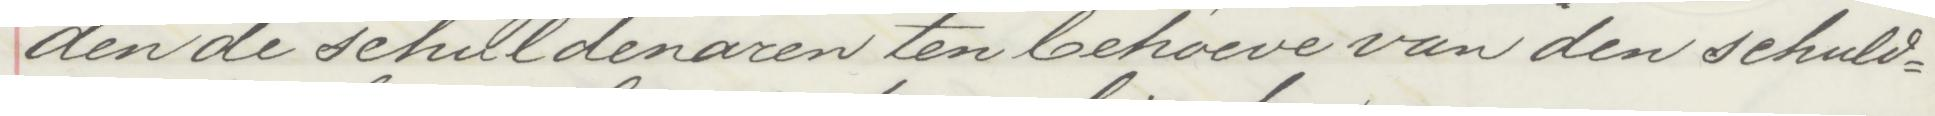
den de schuldenaren ten behoeve van den schuld=
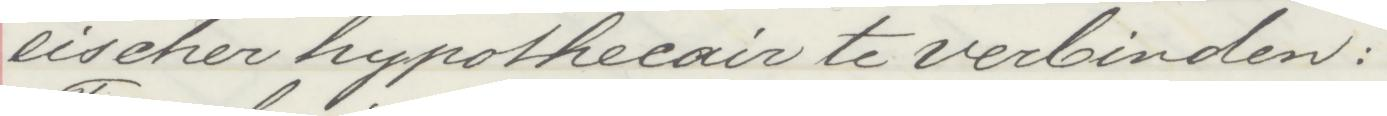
eischer hypothecair te verbinden:
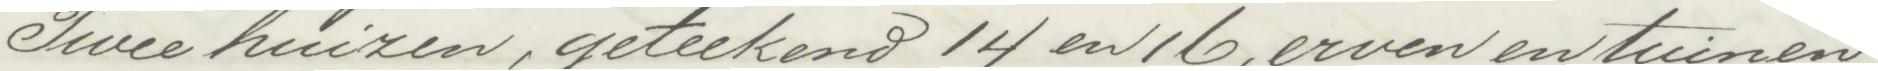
Twee huizen, geteekend 14 en 16, erven en tuinen
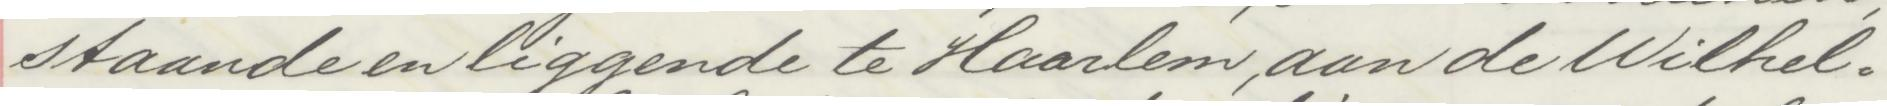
staande en liggende te Haarlem, aan de Wilhel„
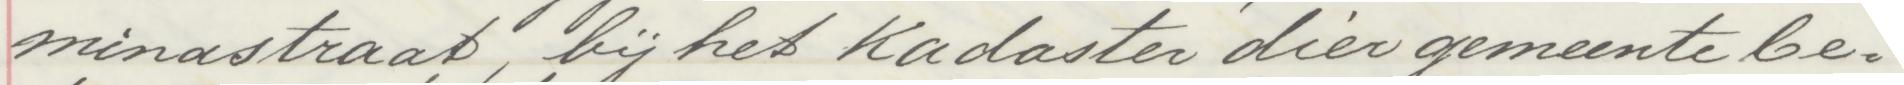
minastraat, bij het kadaster dier gemeente be„
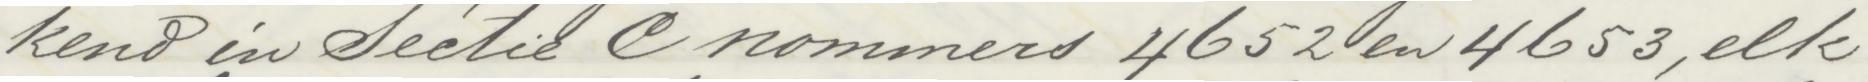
kend in sectie C nommers 4652 en 4653, elk
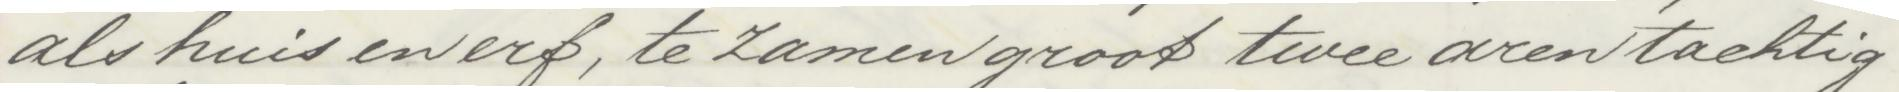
als huis en erf, te zamen groot twee aren tachtig
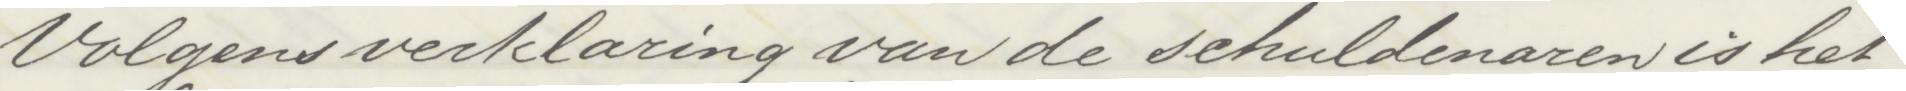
Volgens verklaring van de schuldenaren is het
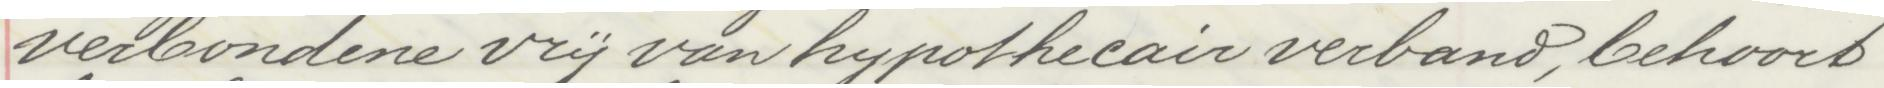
verbondene vrij van hypothecair verband, behoort
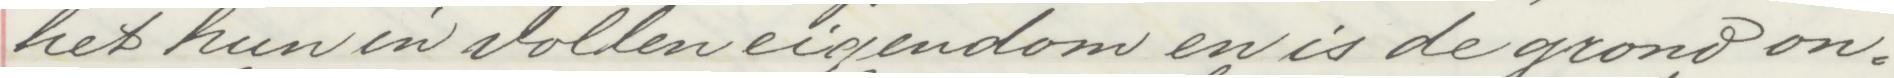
het hun in vollen eigendom en is de grond on„
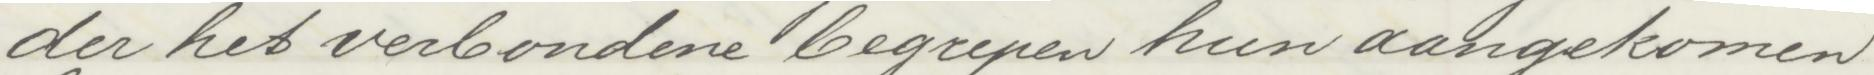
der het verbondene begrepen hun aangekomen
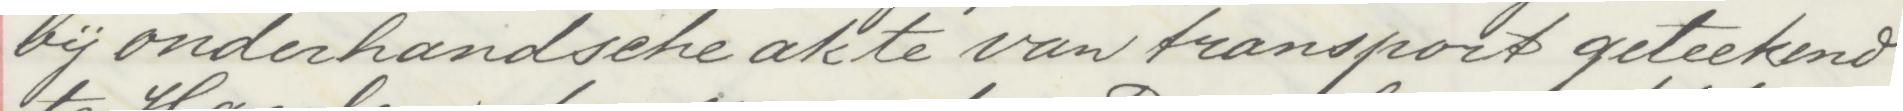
bij onderhandsche akte van transport geteekend
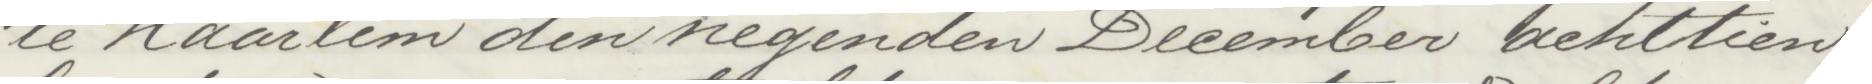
te Haarlem den negenden December achttien
